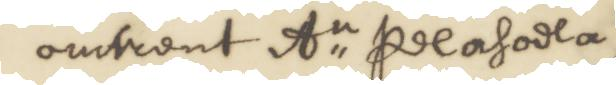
omtrent A„n pelasoela
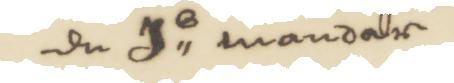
en I„b mandar
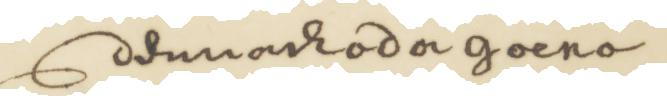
dennachoda goero
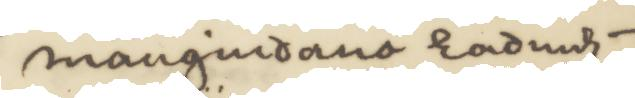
mangindano had men
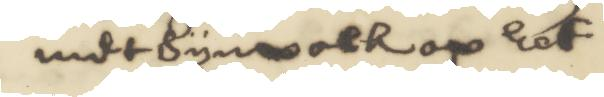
met sijn volk op het
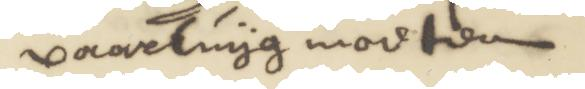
vaartuijg moeten
